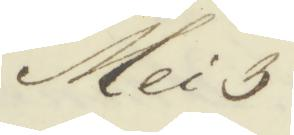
Mei 3
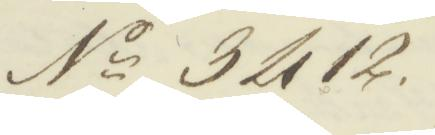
N=o 3412.
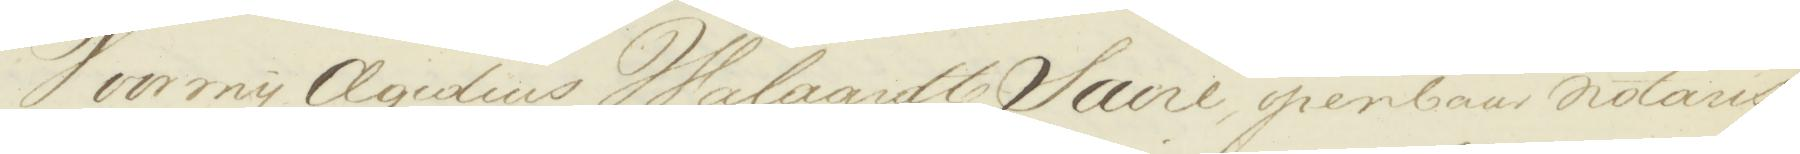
Voor mij AEgidius Walaardt Sacré, openbaar notaris,
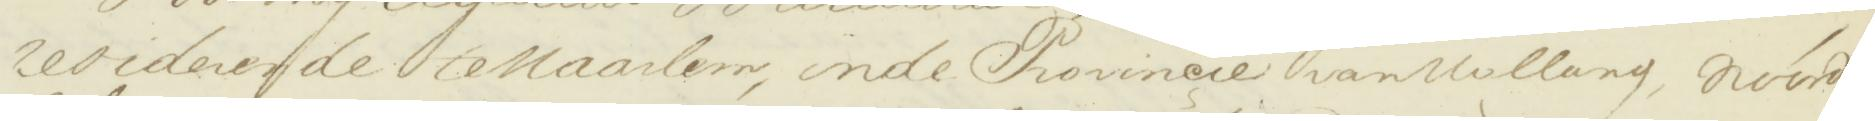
residerende te Haarlem, inde Provincie van Holland, noorde
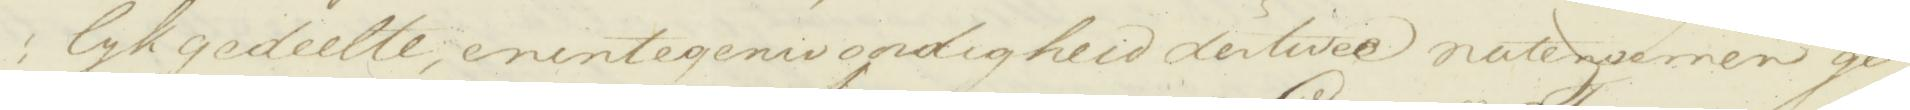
„lyk gedeelte; en integenwoordigheid dertwee natenoemen ge
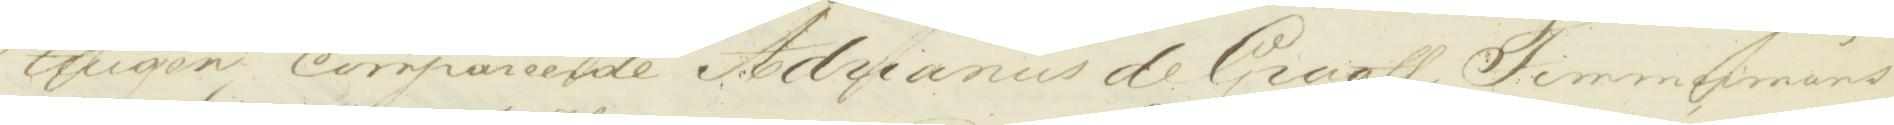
tuigen compareerde Adrianus de Graaff, Timmermans
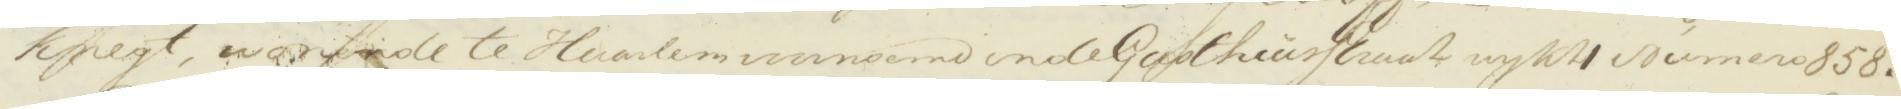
kregt, wonende te Haarlem voornoemd in de Gasthuisstraat wyk 4 Numero 858.
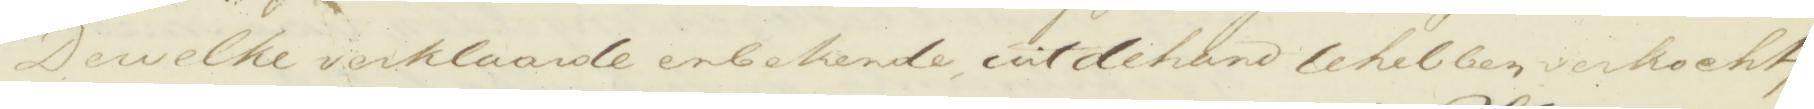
Dewelke verklaarde enbekende, uit de hand te hebben verkocht,
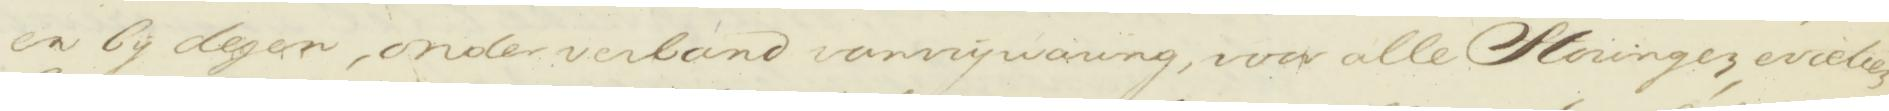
en bij dezen, onder verband vanvrijwaring, voor alle Storingen, evictien
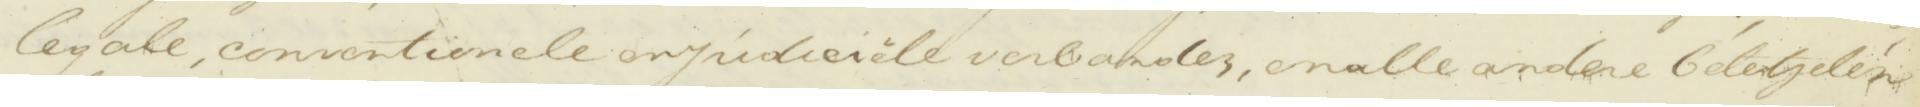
legale, conventionele enjudiciële verbanden, en alle andere beletzelen
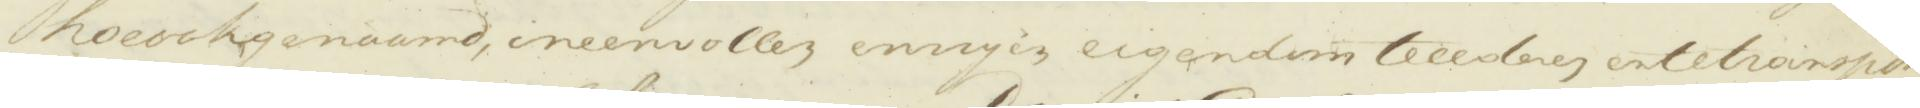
hoeookgenaamd, ineenvollen envryen eigendom tecederen entetranspor,
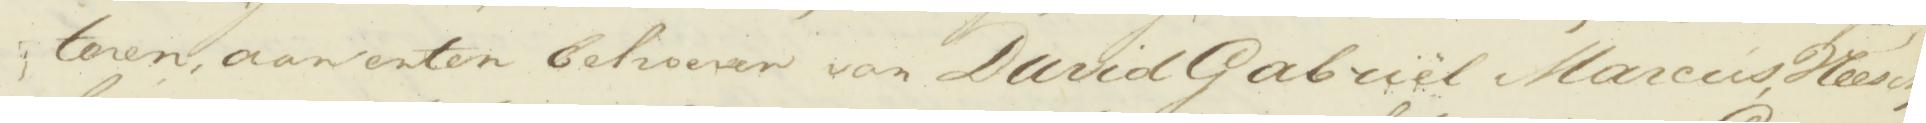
„teren, aan enten behoeven van David Gabriël Marcus, Vleesch
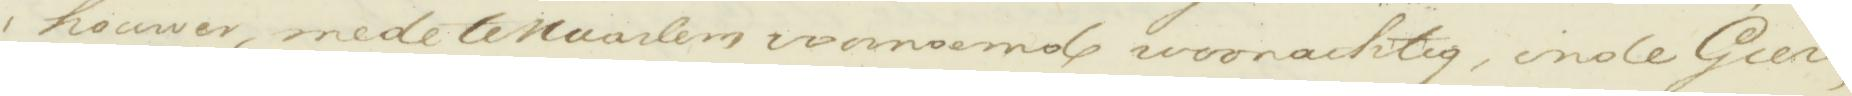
houwer, mede te Haarlem voornoemd woonachtig, inde Gier
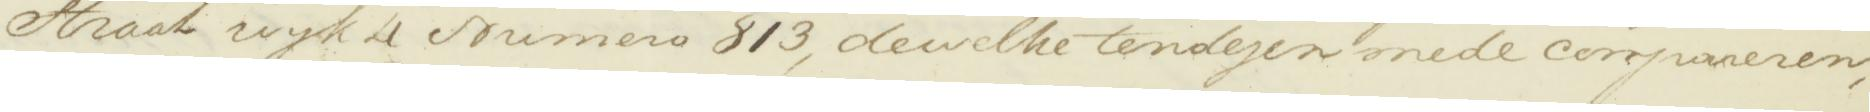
straat wjk 4 Numero 813, dewelke tendezen mede compareren
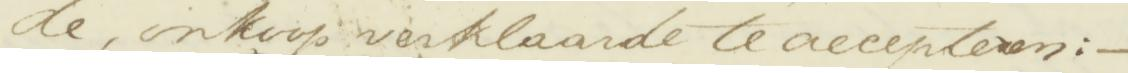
de, inkoop verklaarde te accepteren:-
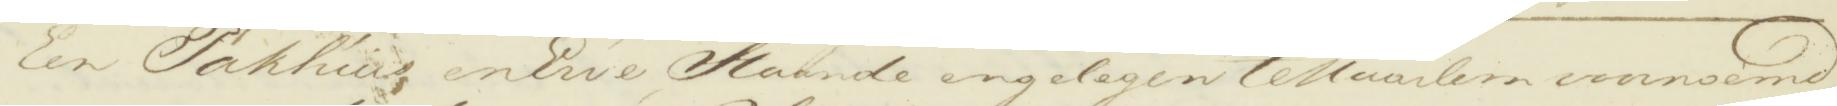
Een Pakhuis en Erve Staande engelegen te Haarlem voornoemd
